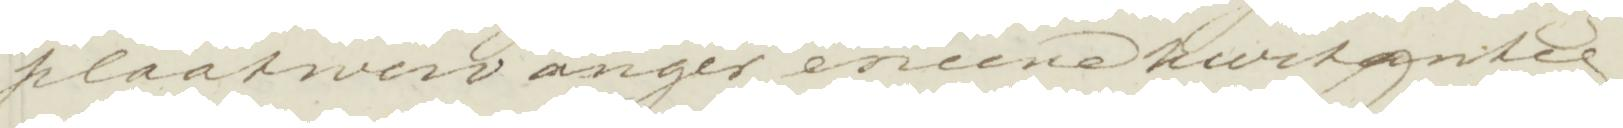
plaatsvervanger en eene kwitantie
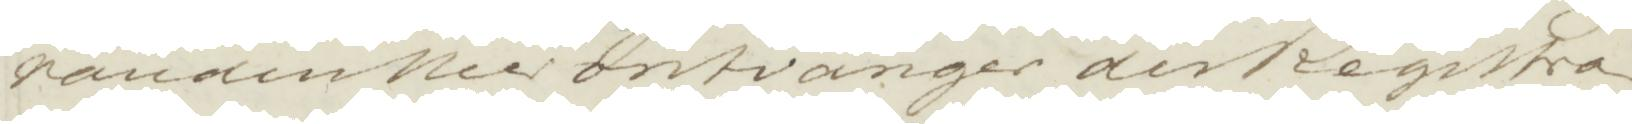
van den Heer ontvanger der Registra
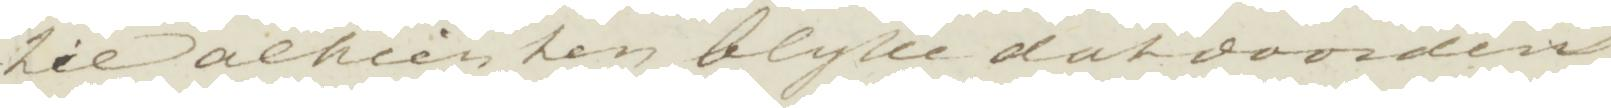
tie alhier ten blyke dat door den
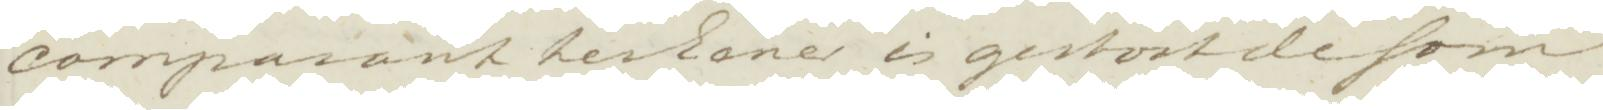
comparant ter Eener is gestort de som
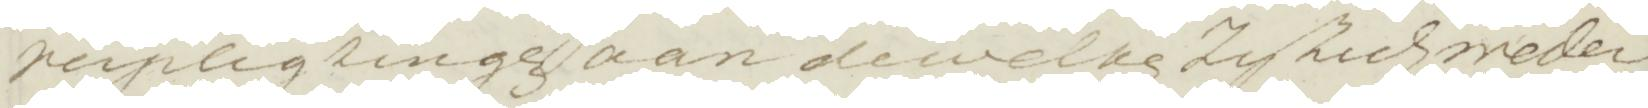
verpligtingen aan dewelke zy zich weder
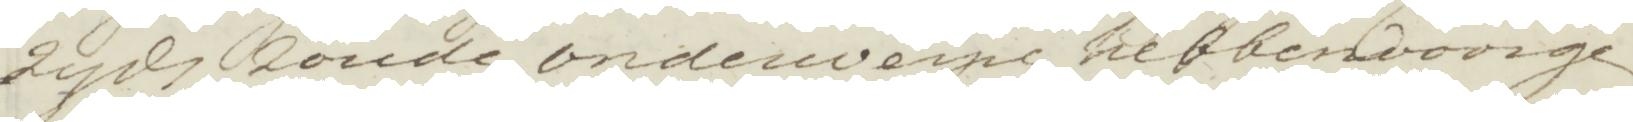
zyds zouden onderwerpen hebben doorge
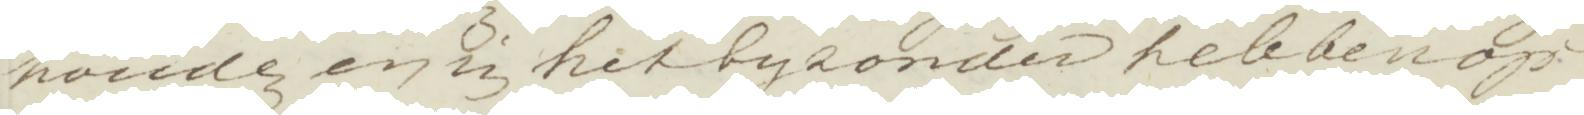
houden en in het by zonder hebben op
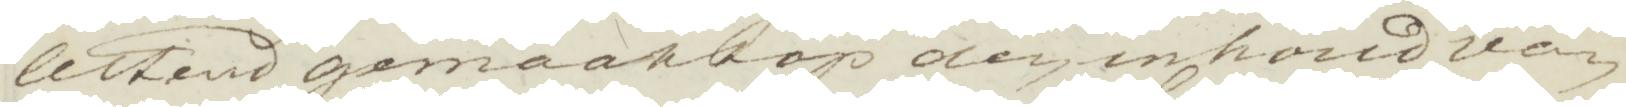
lettend gemaakt op den inhoud van
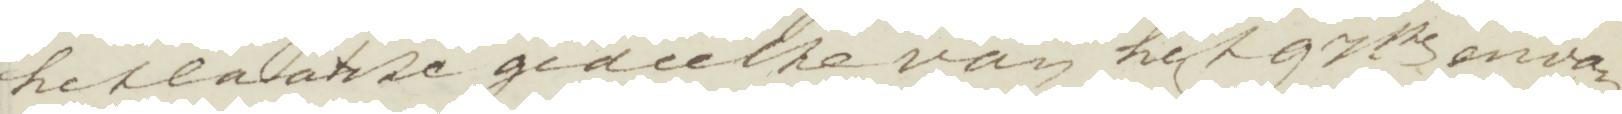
het laatste gedeelte van het 97ste en van
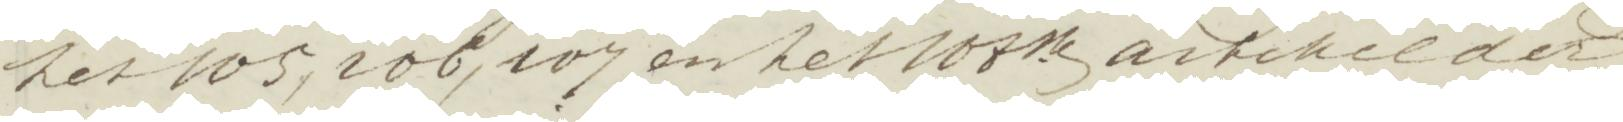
het 105, 106, 107 en het 108.ste artikel der
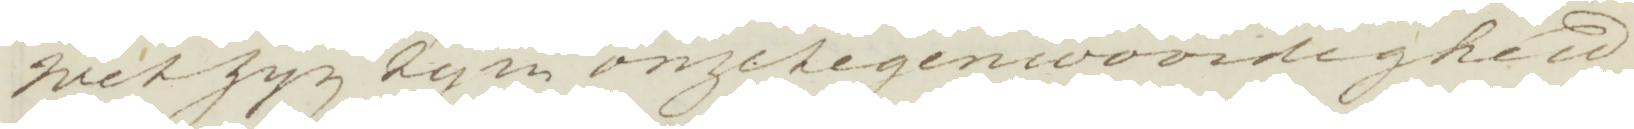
wet zyn zy in onze tegenwoordigheid
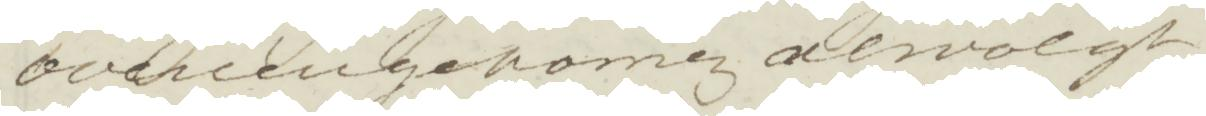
overeengekomen alsvolgt
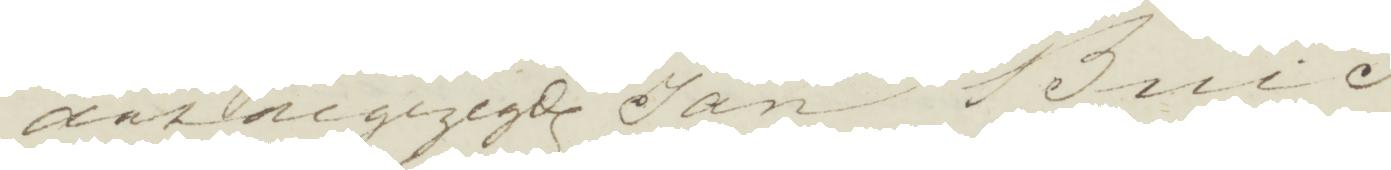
dat de gezegde Jan Buis
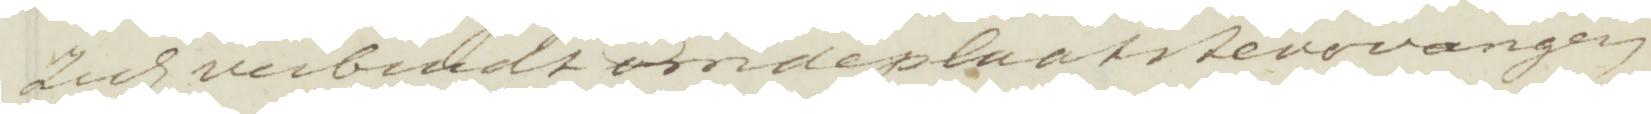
zich verbindt om de plaats te vervangen
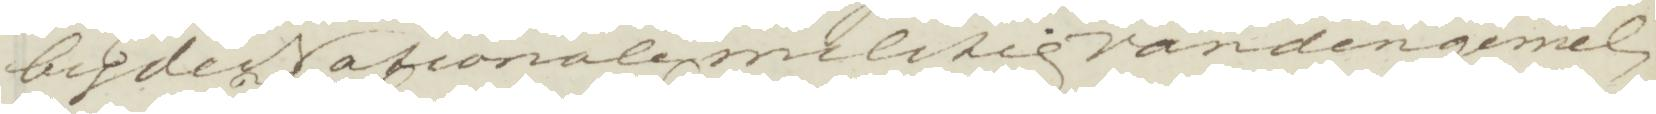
by de Nationale militie van den gemel
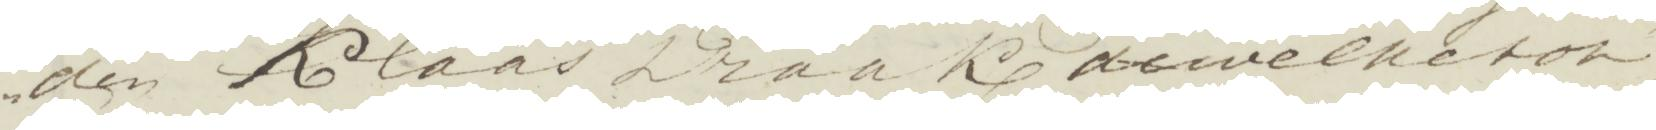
„den Klaas Draak dewelke tot
